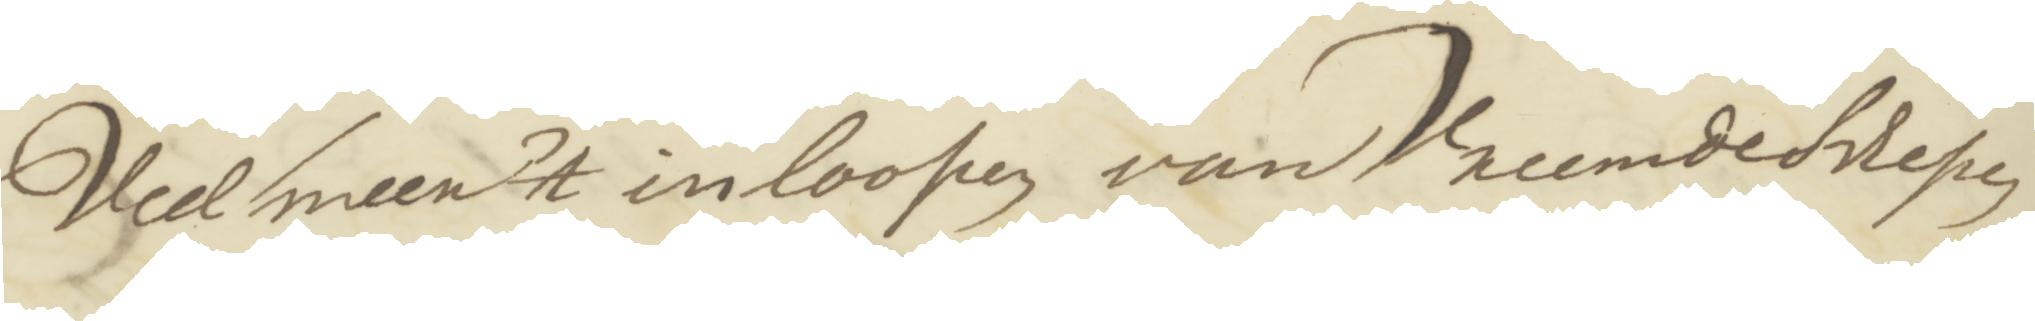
Veel meer ’t inloopen van Vreemde schepen
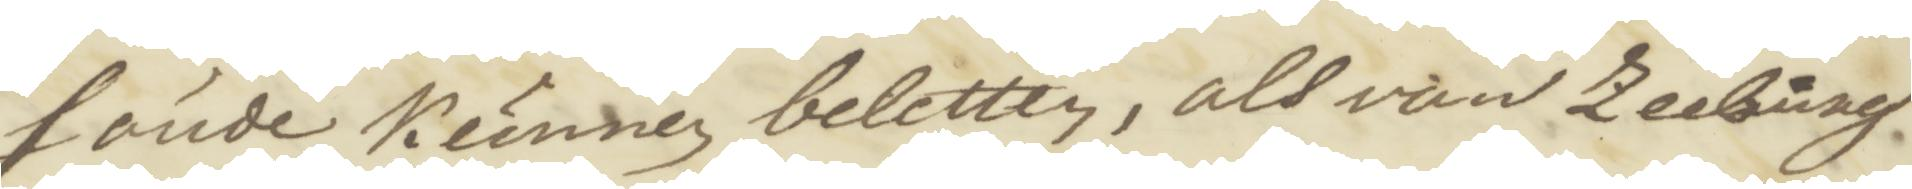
soude kunnen beletten, als van zeeburg
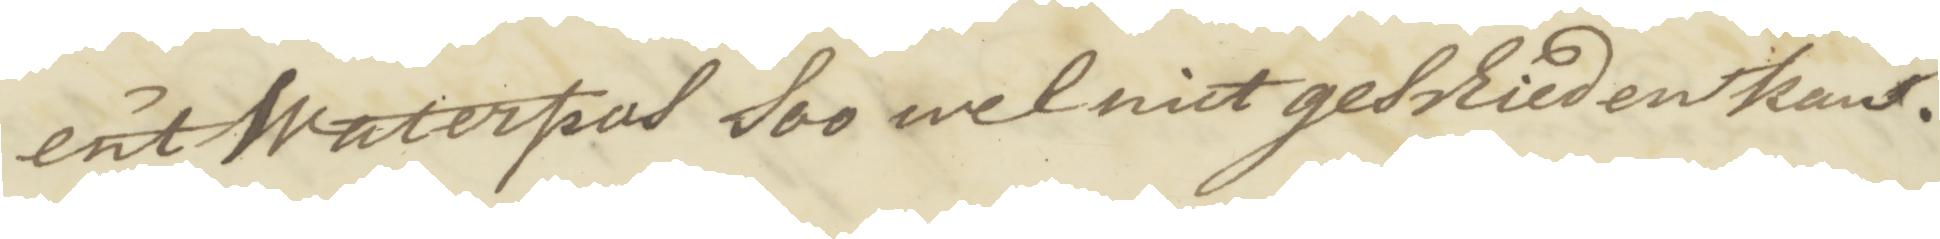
en’t Waterpas soo wel niet geschieden kan.
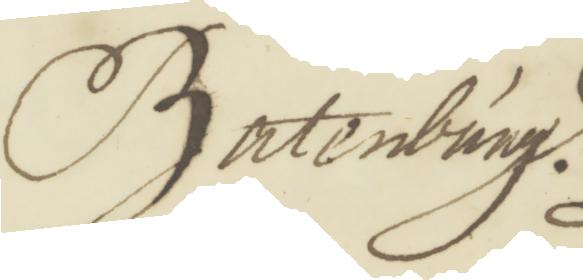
Batenburg.
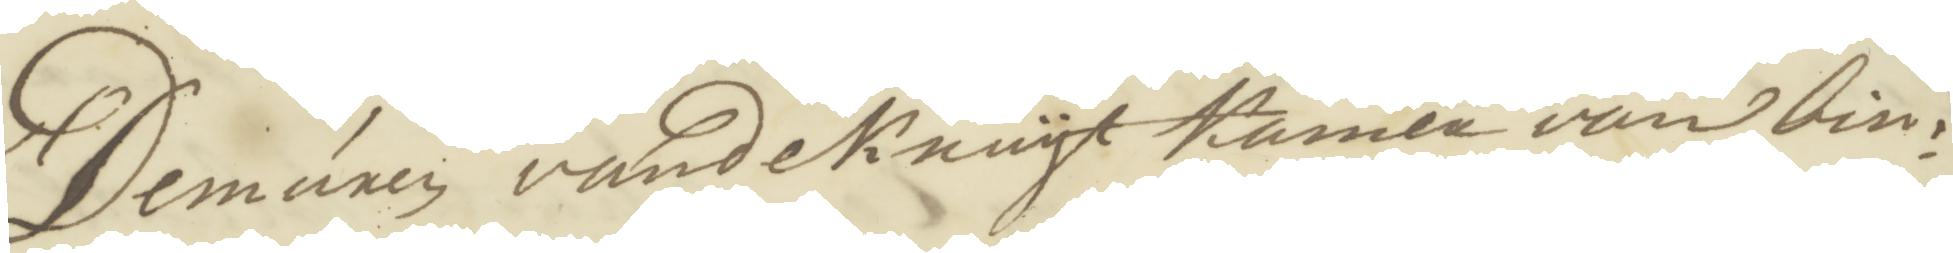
Demuren van de kruijt kamer van bin„
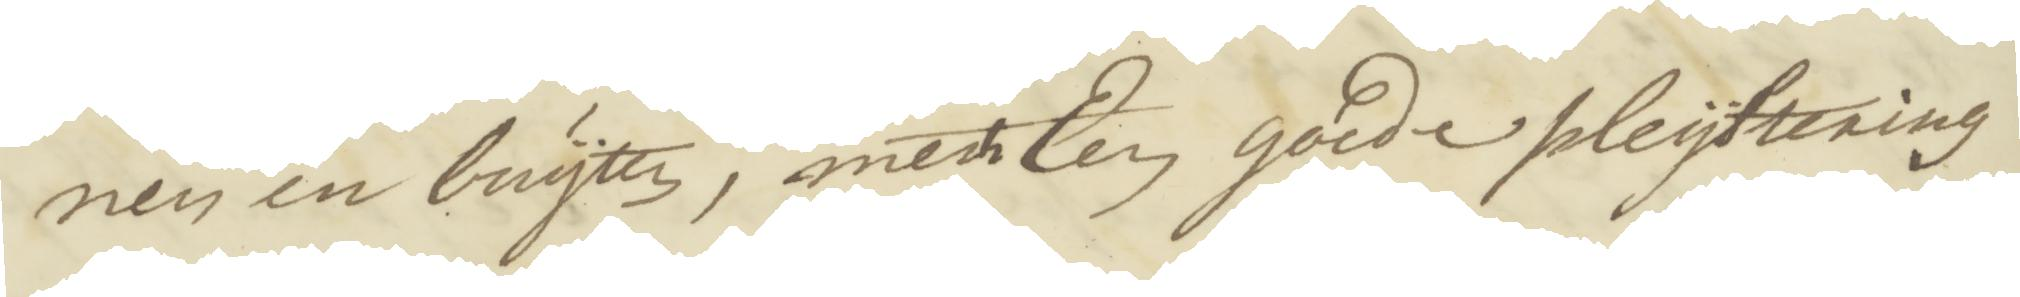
nen en buijten, met Een goede pleijstering
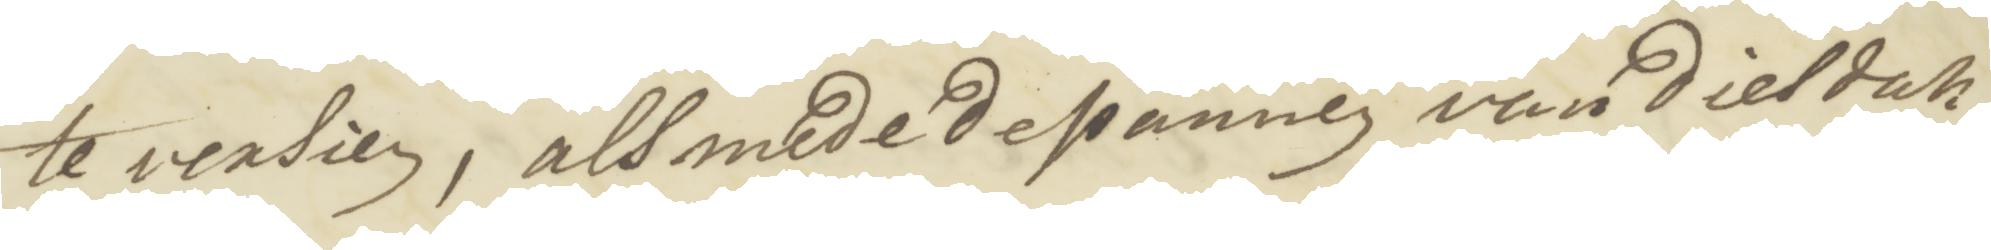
te versien, als mede de pannen van dies dak
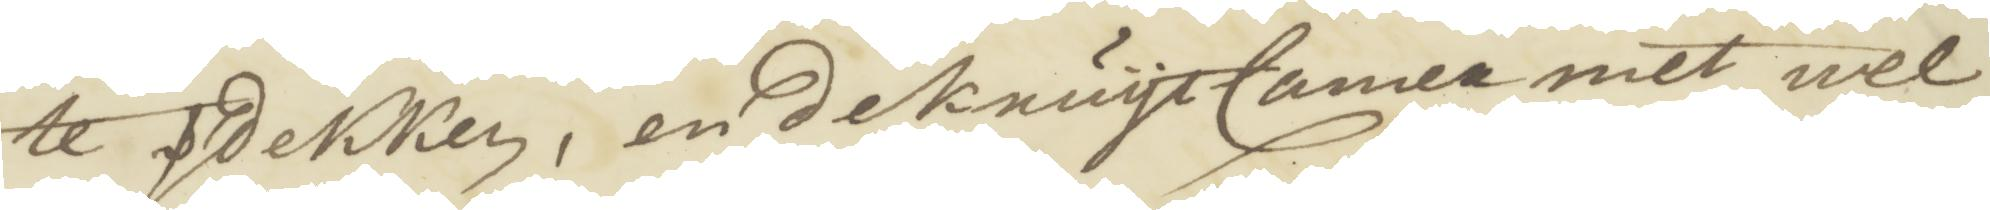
te verdekken, en de kruijt Camer met wel
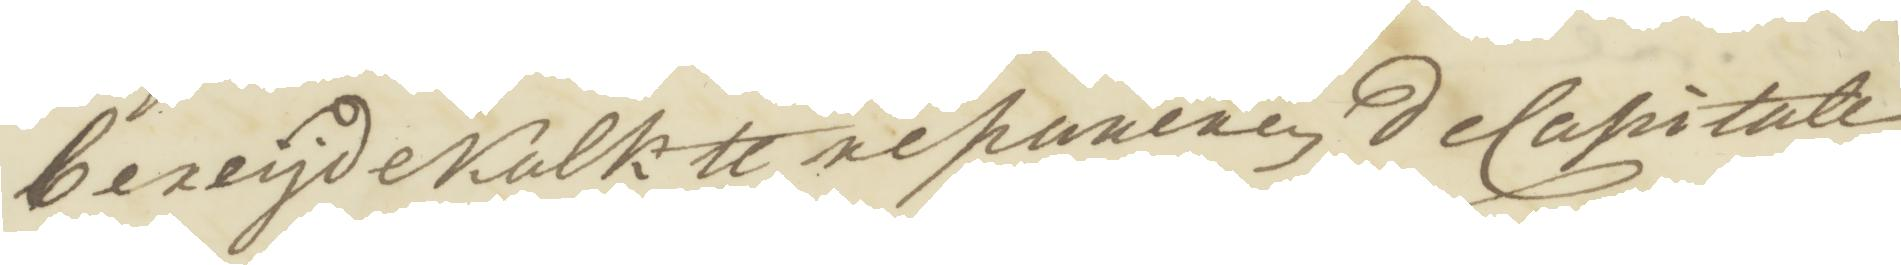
bereijde kalk te repareren de Capitale
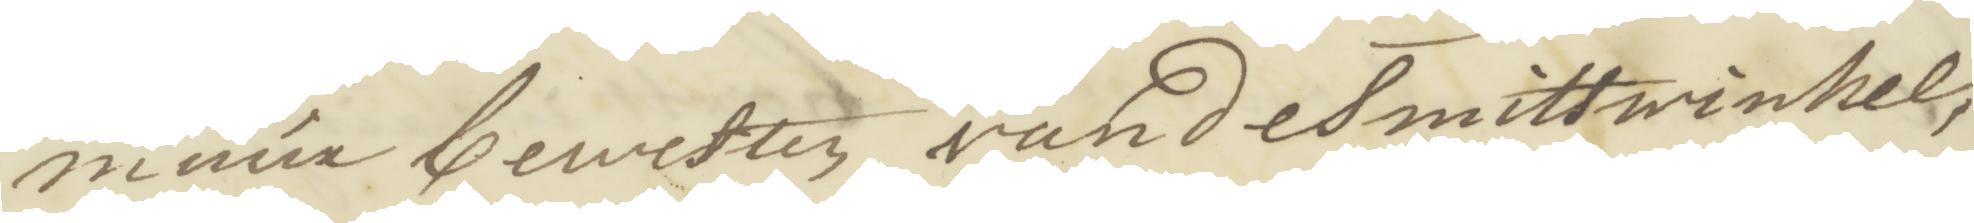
muur bewesten van desmitswinkel,
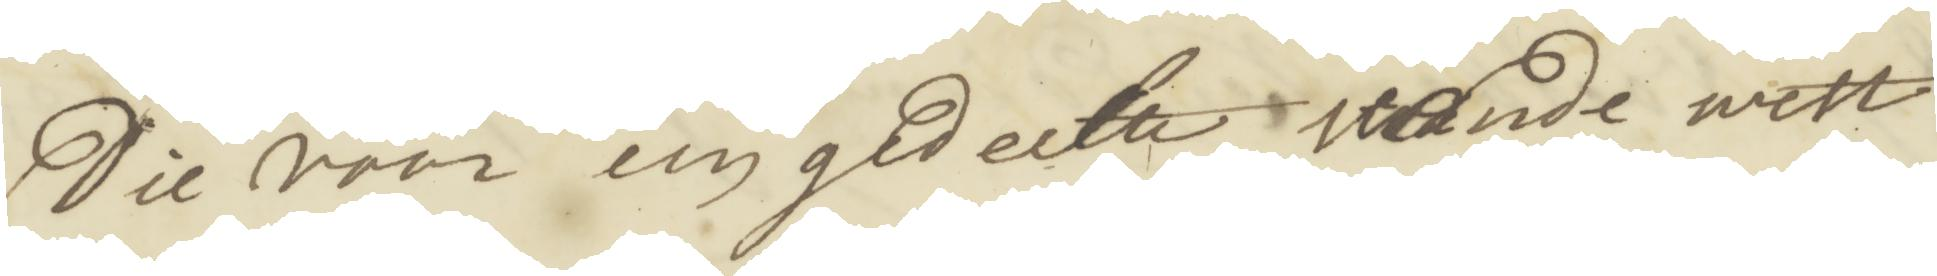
die voor een gedeelte vande west
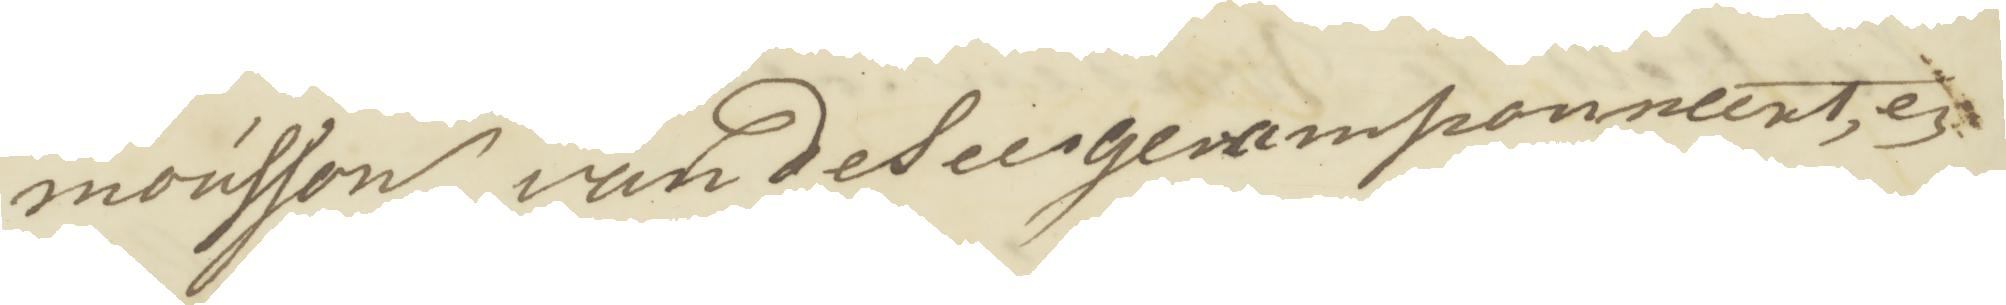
mousson van desee geramponneert, en
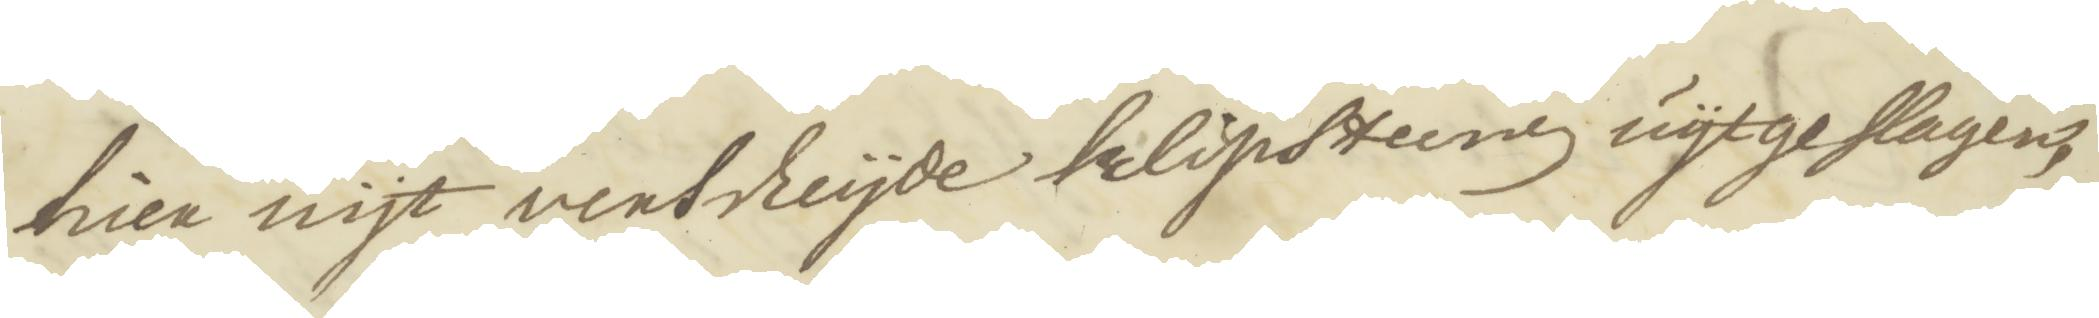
hier uijt verscheijde klipsteenen uijtgeslagen,
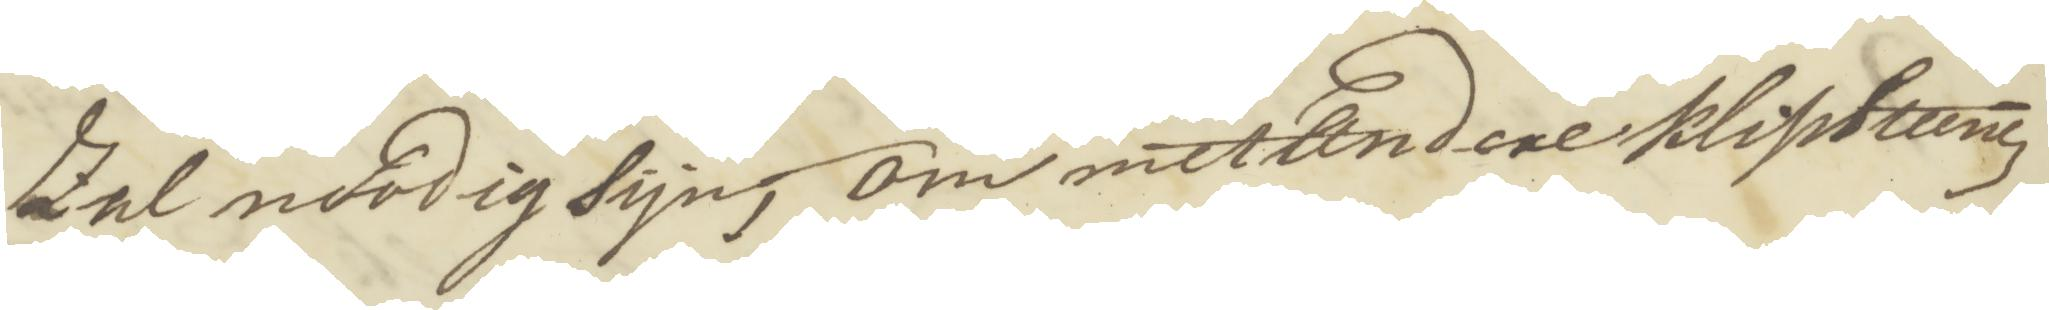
zal noodig sijn, om met Andere klipsteenen
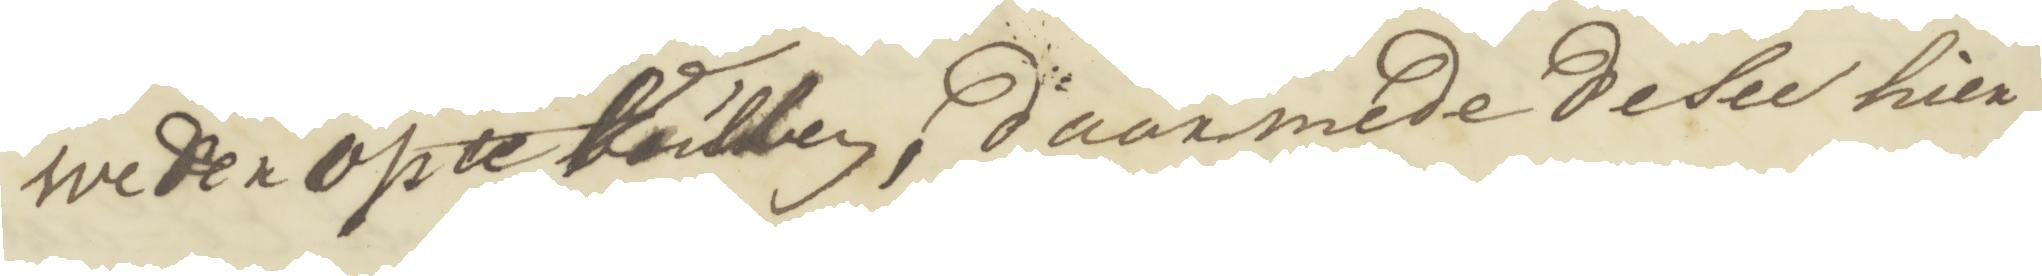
weder op te bouwen, daarmede desee hier
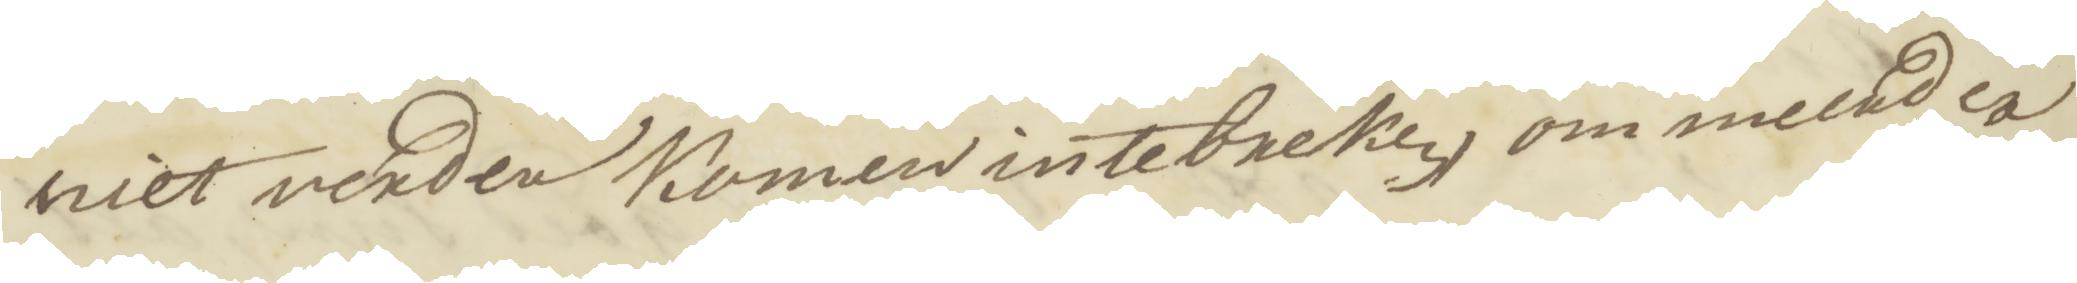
niet verder komen in te breken, om meerder
